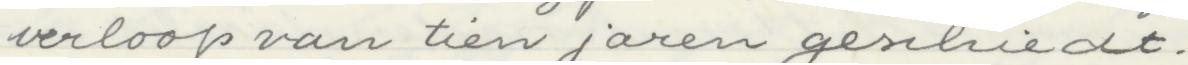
verloop van tien jaren geschiedt
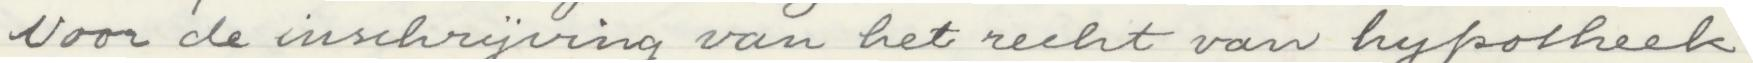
voor de inschrijving van het recht van hypotheek
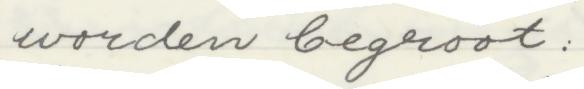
worden begroot:
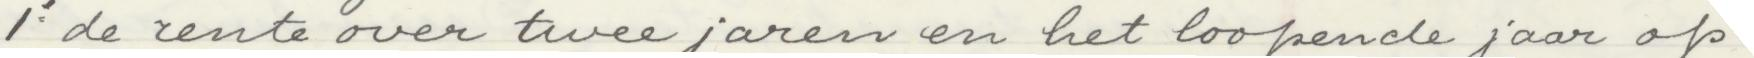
1=o de rente over twee jaren en het loopende jaar op
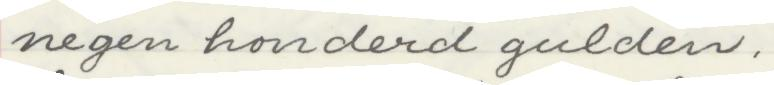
negen honderd gulden.
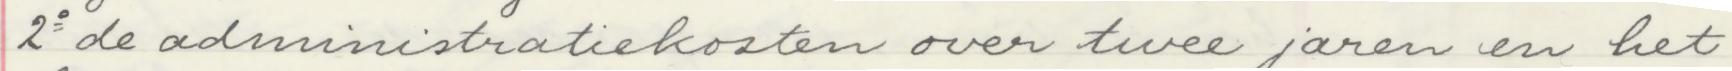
2=o de administratiekosten over twee jaren en het
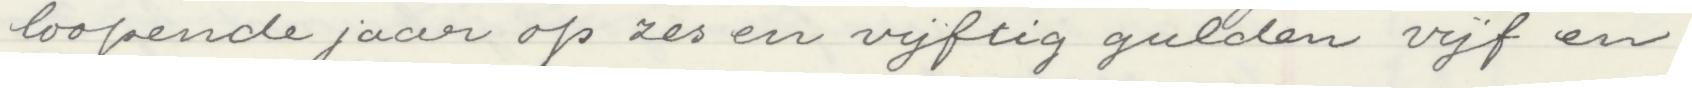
loopende jaar op zes en vijftig gulden vijf en
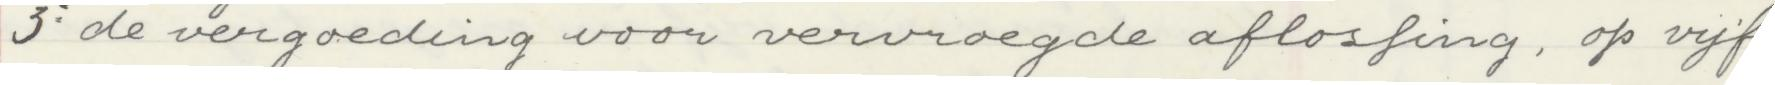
3=o de vergoeding voor vervroegde aflossing, op vijf
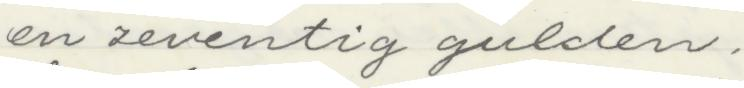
en zeventig gulden
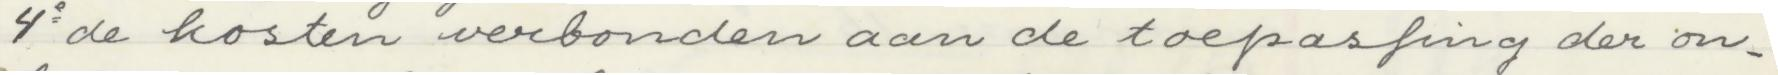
4=o de kosten verbonden aan de toepassing der on-
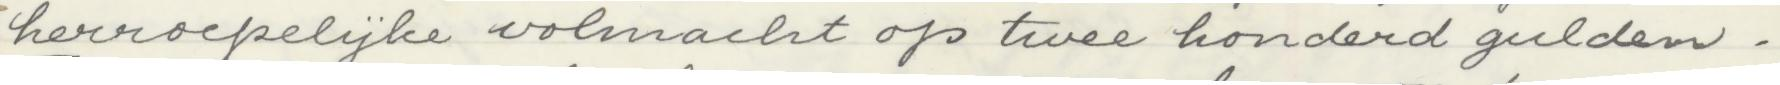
herroepelijke volmacht op twee honderd gulden -
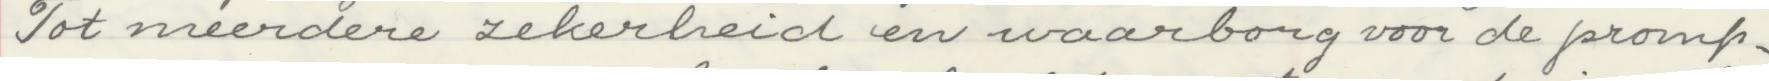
Tot meerdere zekerheid en waarborg voor de promp
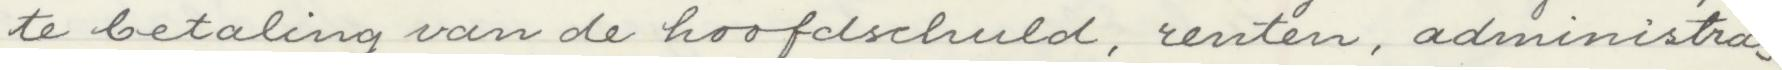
te betaling van de hoofdschuld, renten, administra-
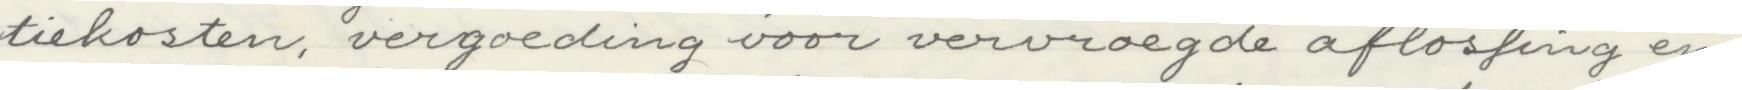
tiekosten, vergoeding voor vervroegde aflossing en
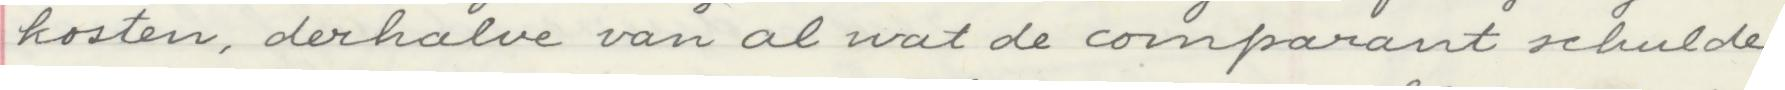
kosten, derhalve van al wat de comparant schulde
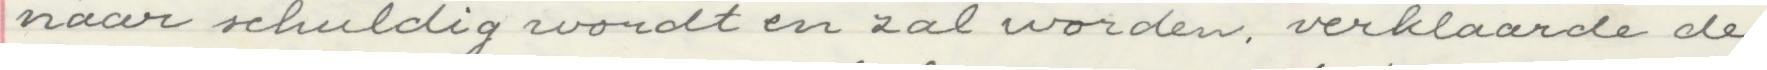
naar schuldig wordt en zal worden, verklaarde de
